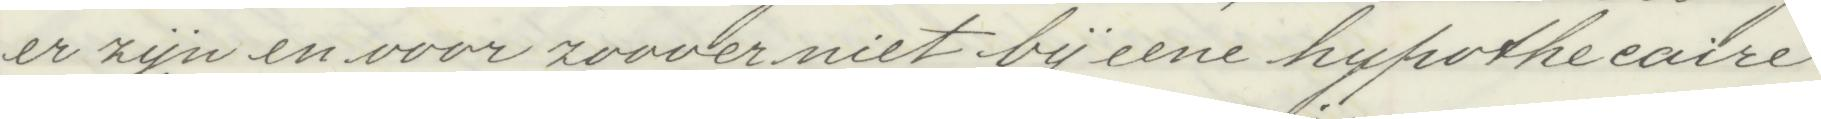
er zijn en voor zoover niet bij eene hypothecaire
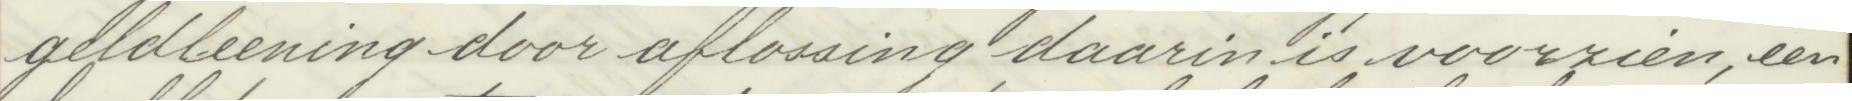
geldleening door aflossing daarin is voorzien, een
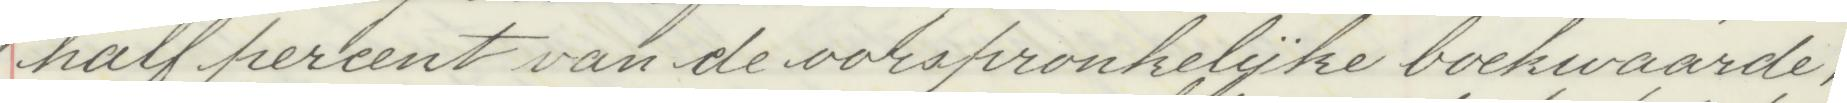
half percent van de oorspronkelijke boekwaarde;
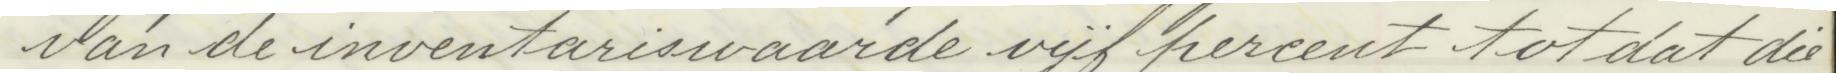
van de inventariswaarde vijf percent tot dat die
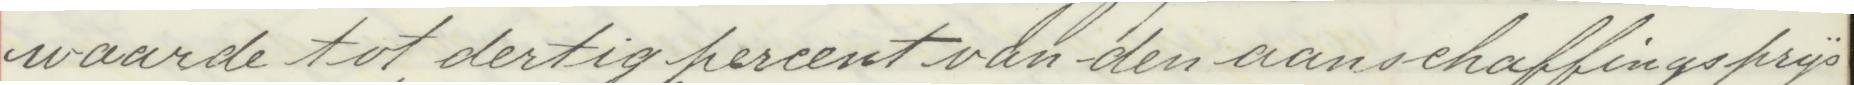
waarde tot dertig percent van den aanschaffingsprijs
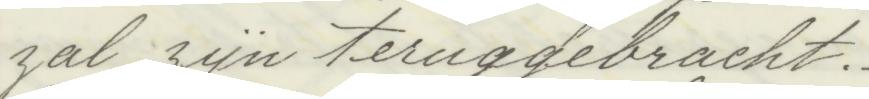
zal zijn teruggebracht.
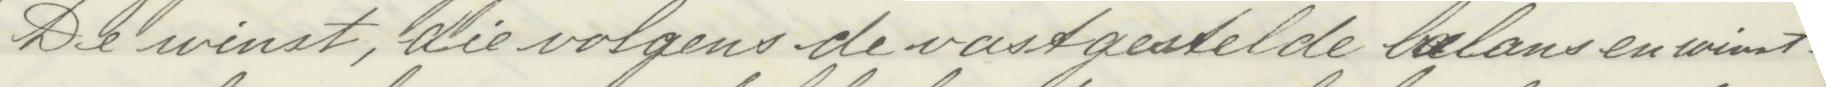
De winst, die volgens de vastgestelde balans en winst-
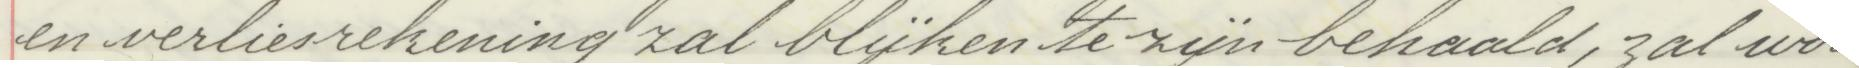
en verliesrekening zal blijken te zijn behaald, zal wor-
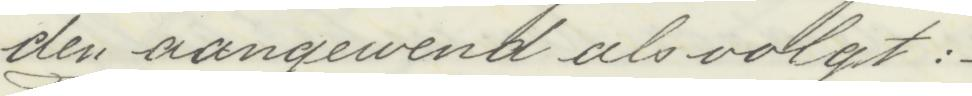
den aangewend als volgt:
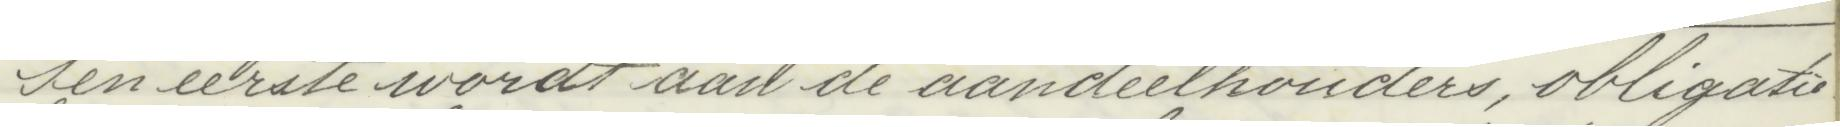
Ten eerste wordt aan de aandeelhouders, obligatie
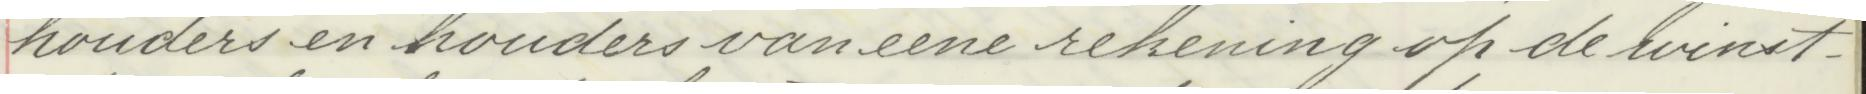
houders en houders van eene rekening op de winst-
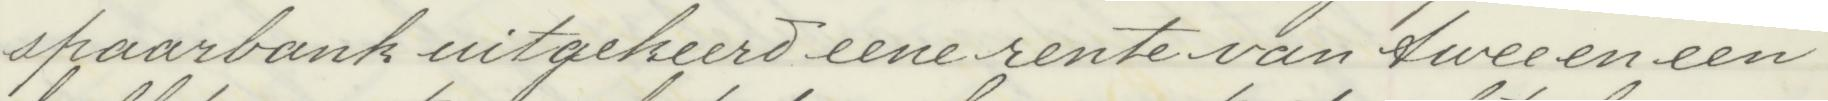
spaarbank uitgekeerd eene rente van twee en een
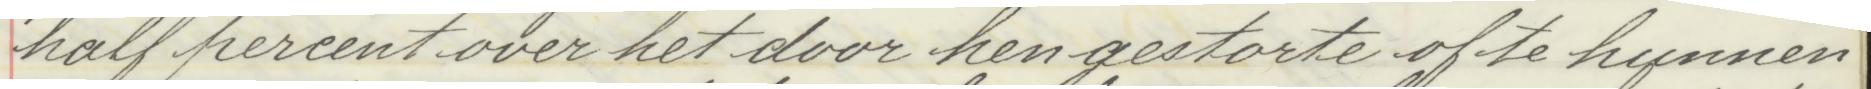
half percent over het door hen gestorte of te hunnen
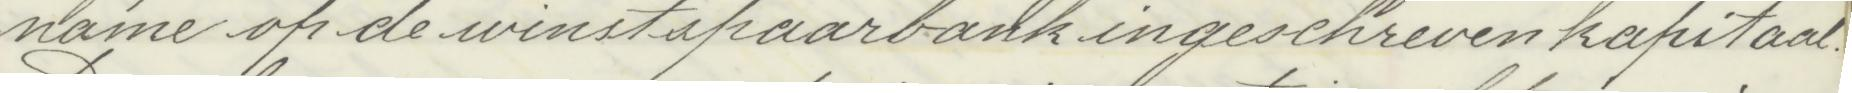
name op de winstspaarbank ingeschreven kapitaal.
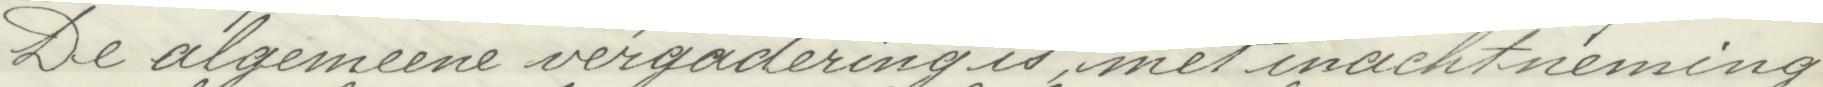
De algemeene vergadering is met inachtneming
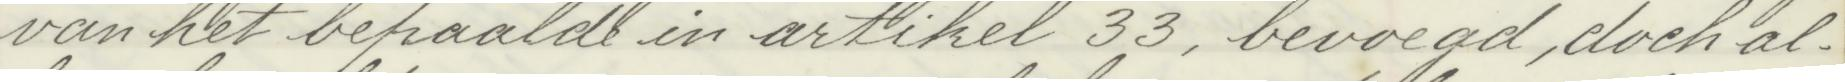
van het behaalde in artikel 33, bevoegd, doch al-
